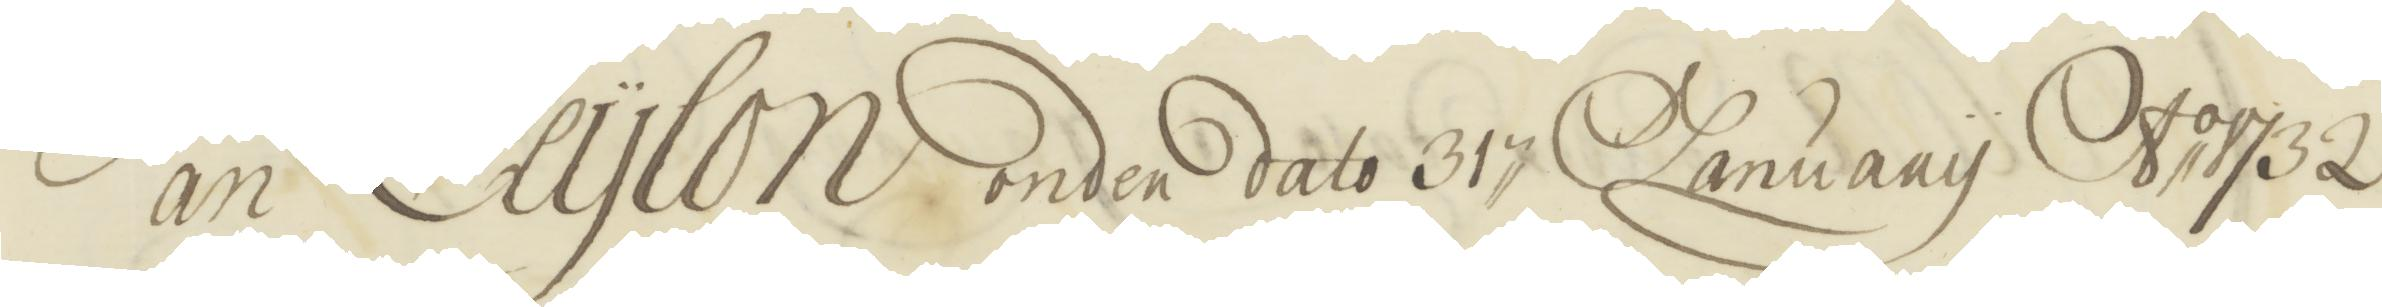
Van Ceijlon, onder dato 31„ Ianuarij A„o 1732
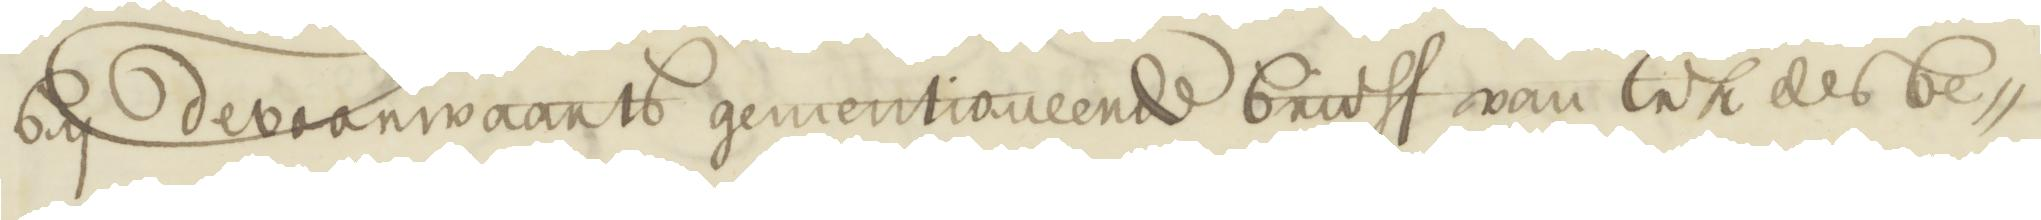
by de voorwaarts gementioneerde brieff van tek des be„
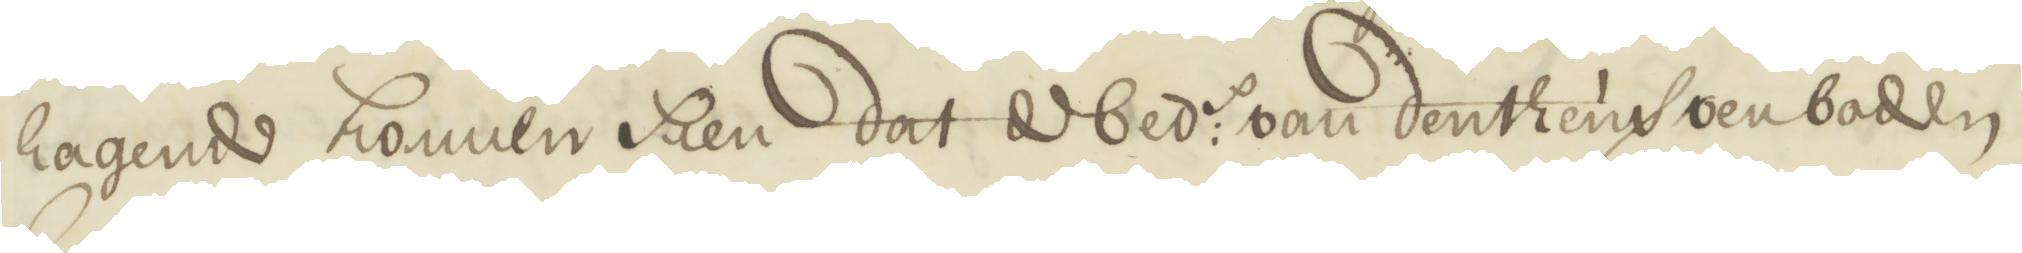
hagende konnen Sien dat de bed:s van den theuver verboden
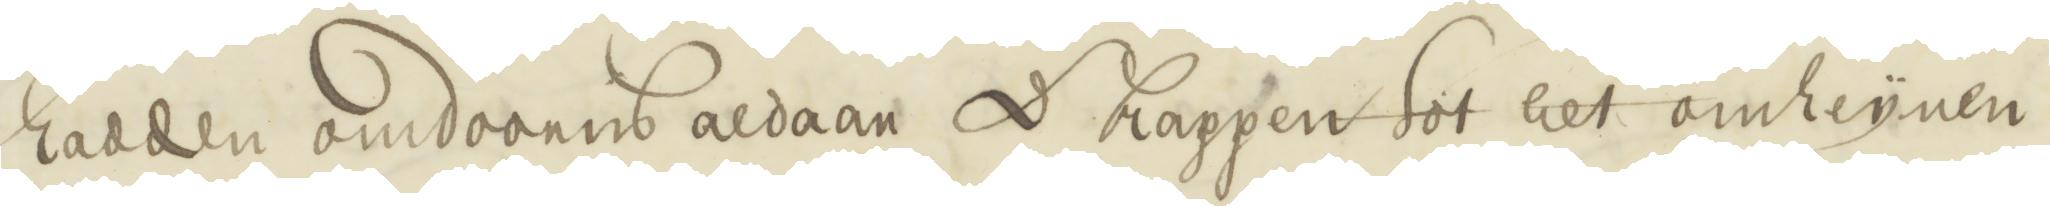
hadden om doorns aldaar te kappen tot het omheijnen
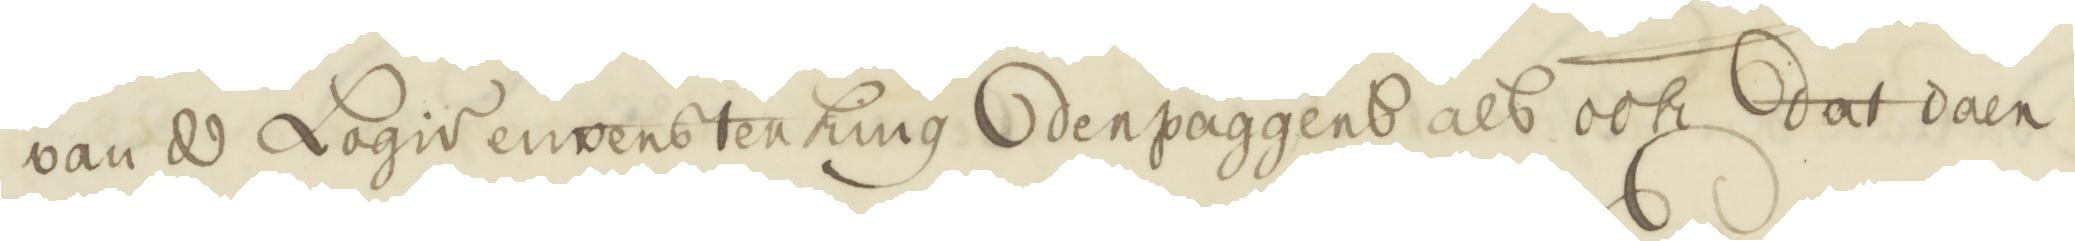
van de Logie en versterking der paggers als ook dat daer
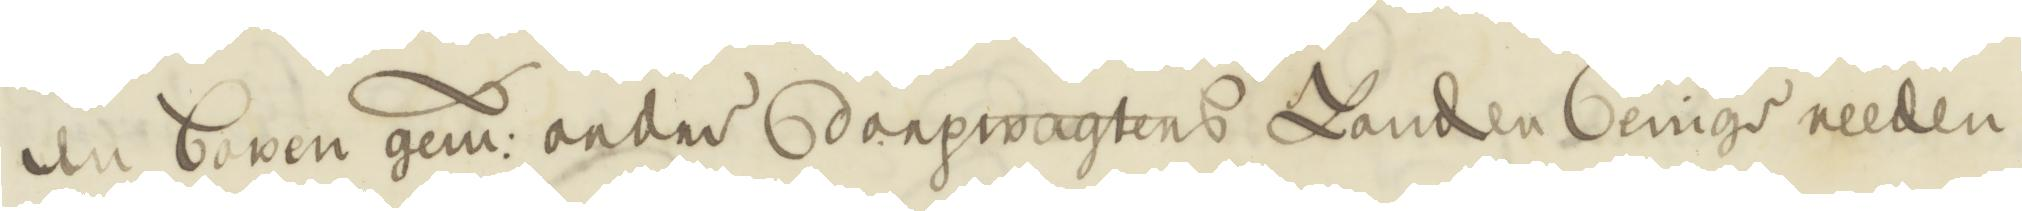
en boven gem: ordre dorpwagters Zonder Eenige reeden
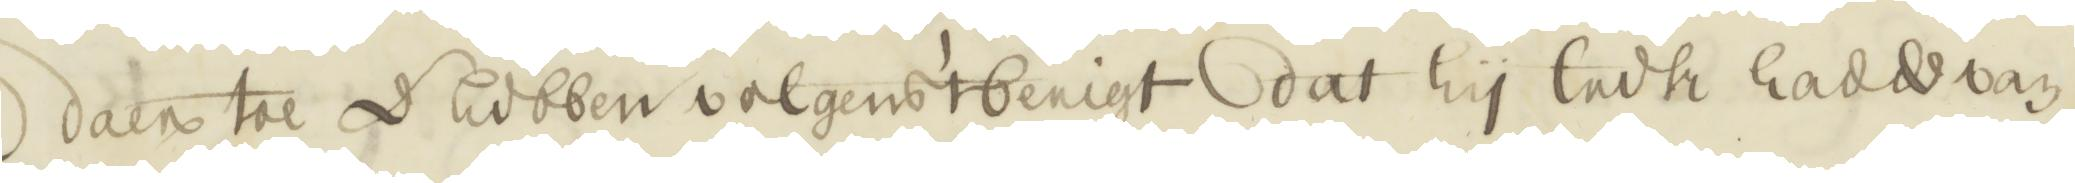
daer toe te hebben volgens 't berigt dat hij trek hadde van
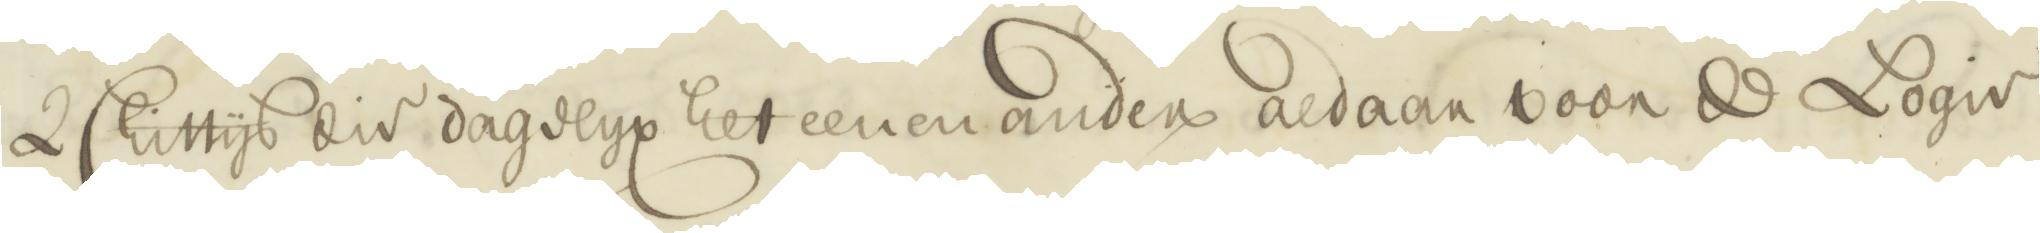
2 Chittijs die dagelyx het een en ander aldaar voor de Logie
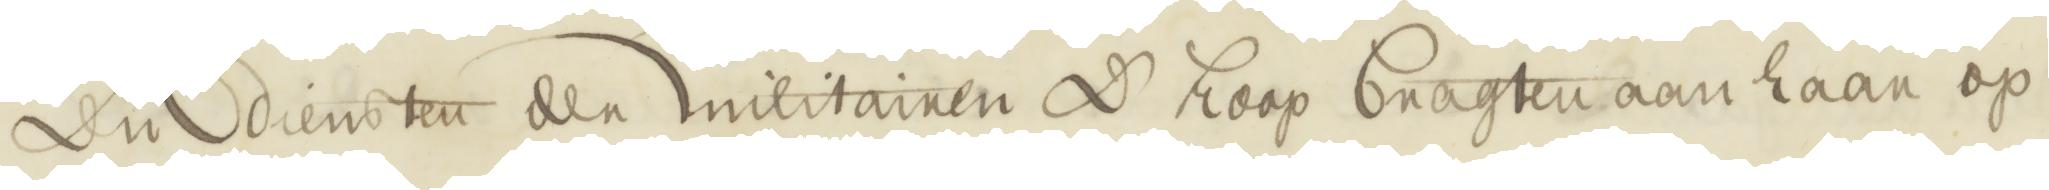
ten diensten der militairen te koop bragten aan haar op
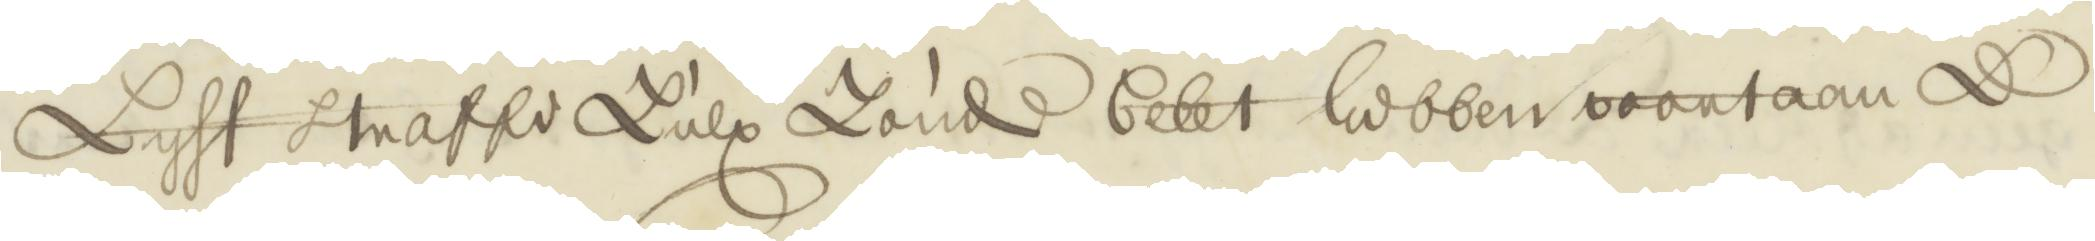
Lyff straffe Zulx zoude belet hebben voortaan te
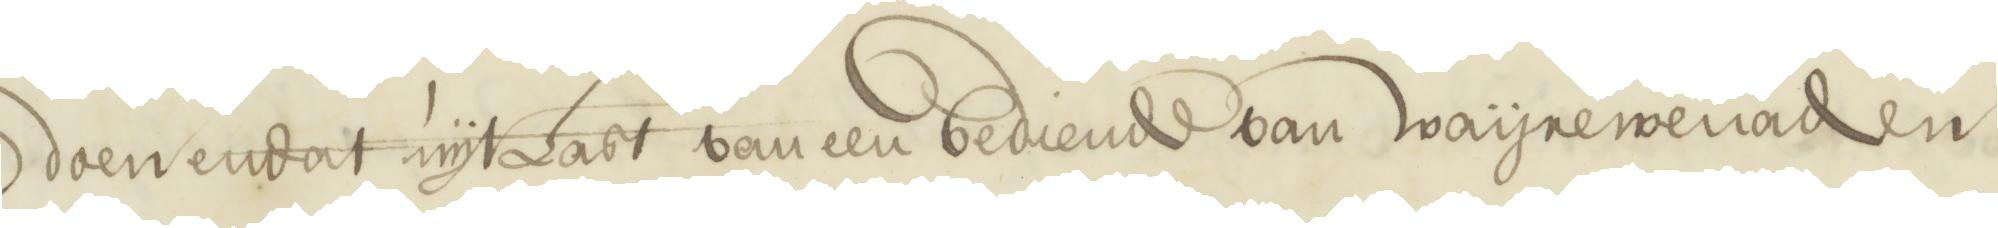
doen en dat uijt last van een bediende van waijrewenaden
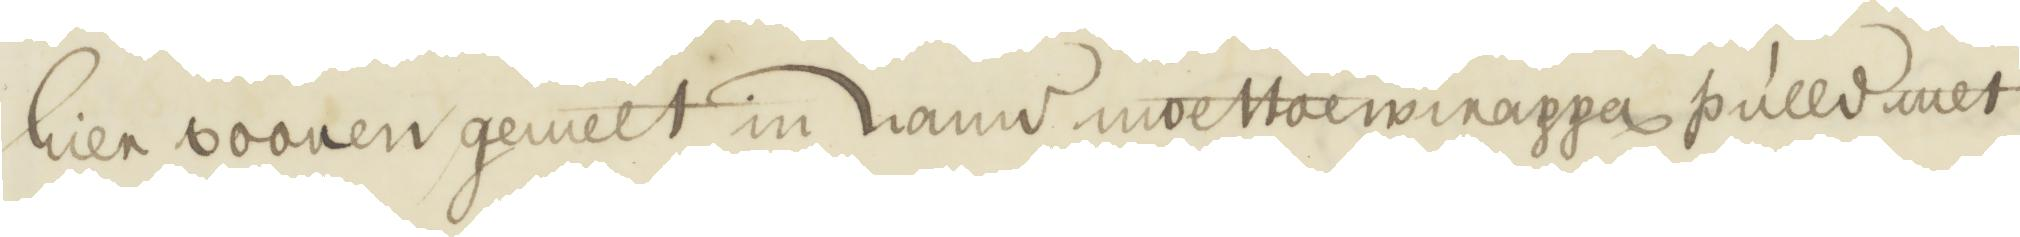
hier vooren gemelt in name moettoewirappa pulle met
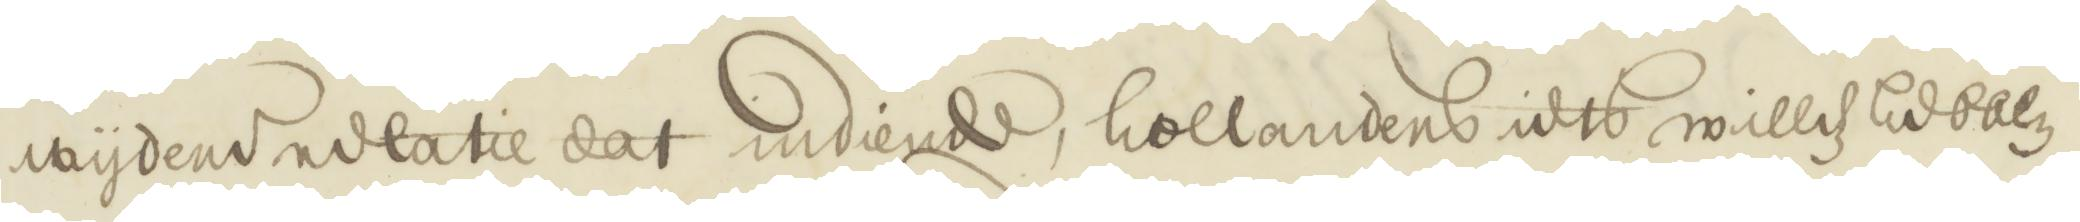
wijdere relatie dat indien de, hollanders iets willen hebben
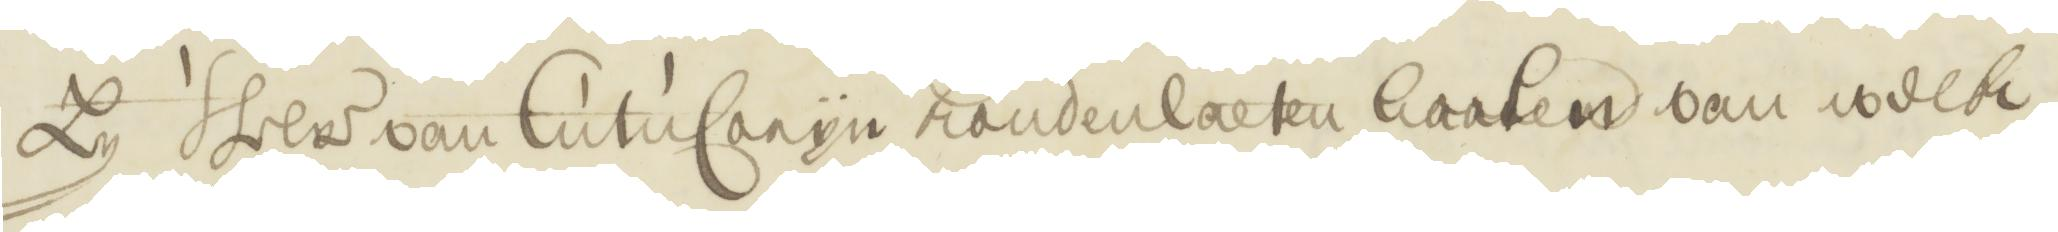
Zy 'tselve van Tutucorijn konden laeten haalen van welk
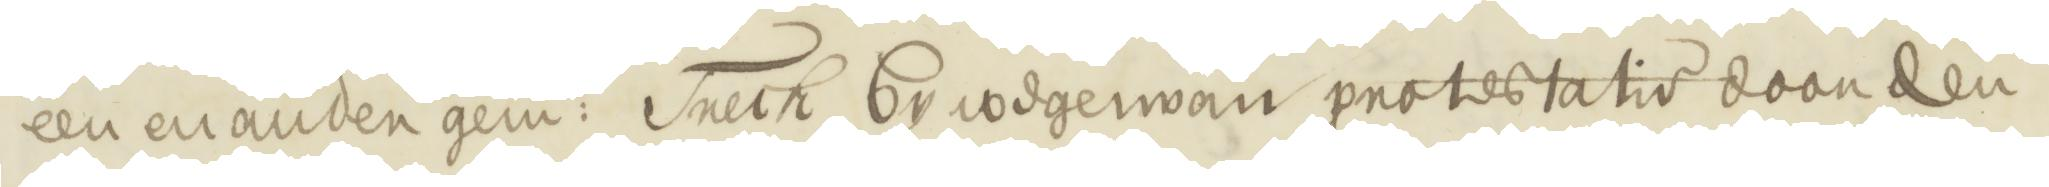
een en ander gem:te Treck bij wegen van protestatie door den
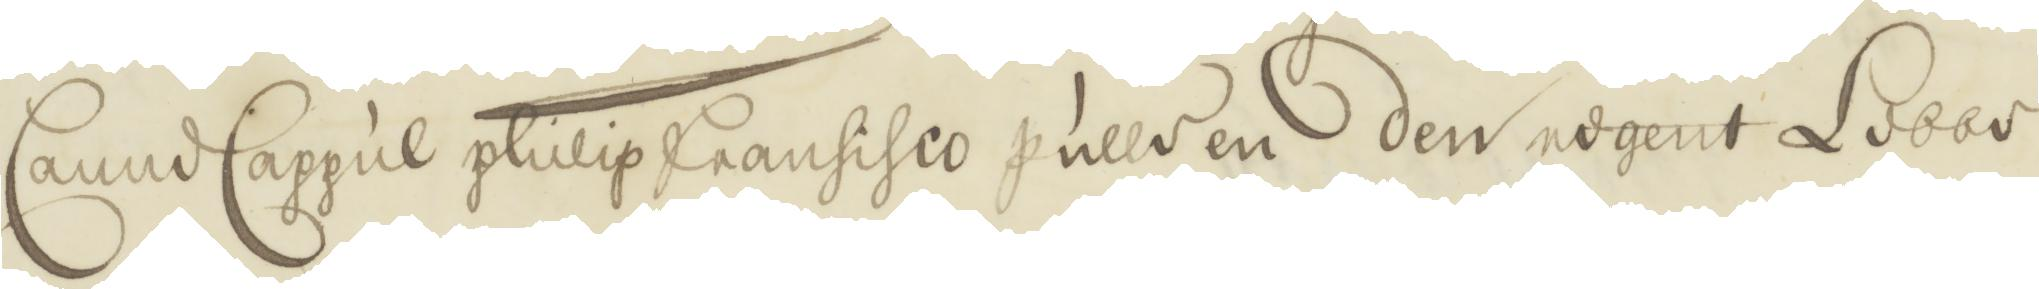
Canne Cappul philip fransisco pulle en den regent Lebbe
